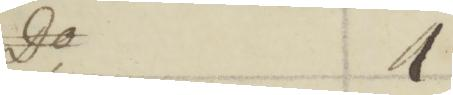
D„o 4
